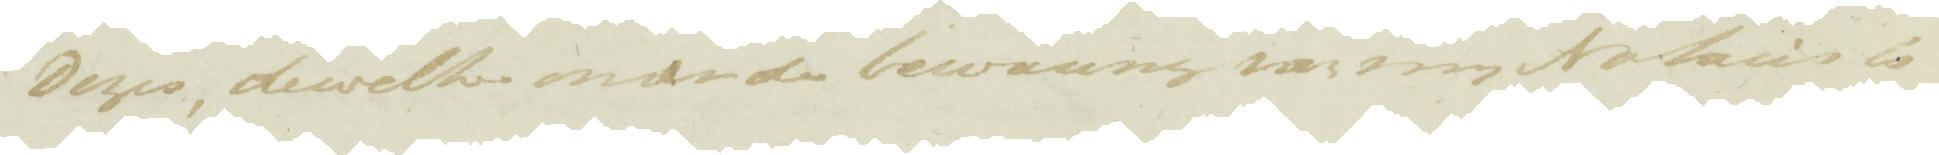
dezes, dewelke onder de bewaring van my Notaris is
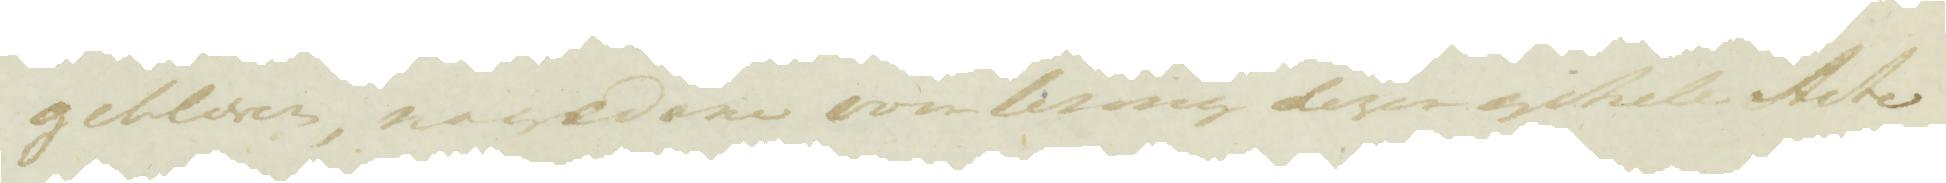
gebleven, nagedane voorlezing dezen gehele Acte
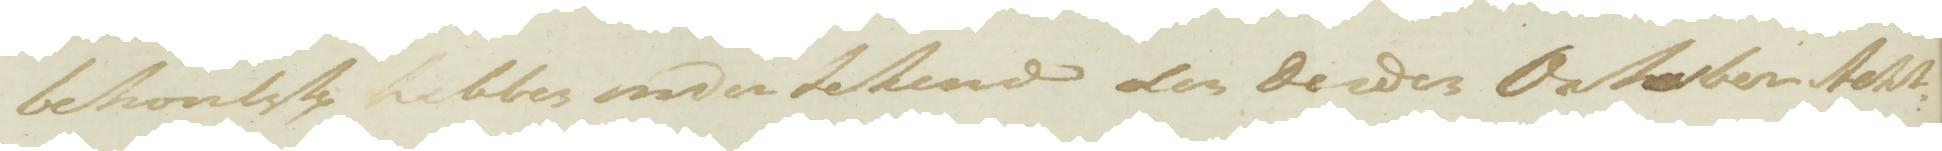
behoorlyk hebben ondertekend den derden October Acht„
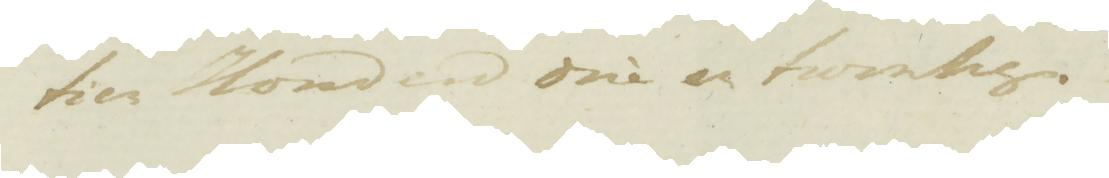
tien Honderd drie en twintig.
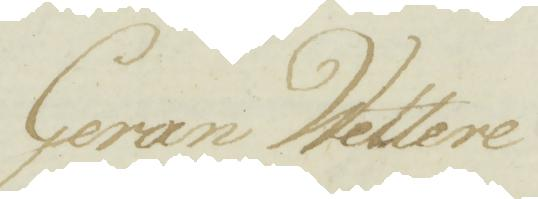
Geran Wettere
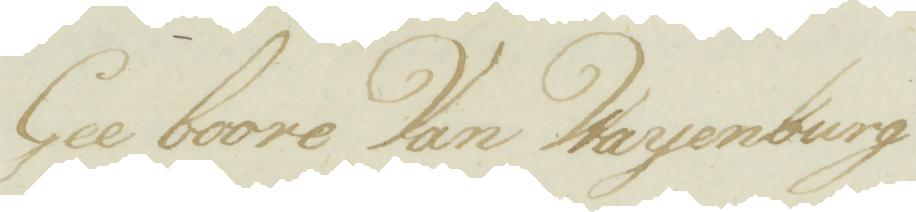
Gee boore Van Wayenburg
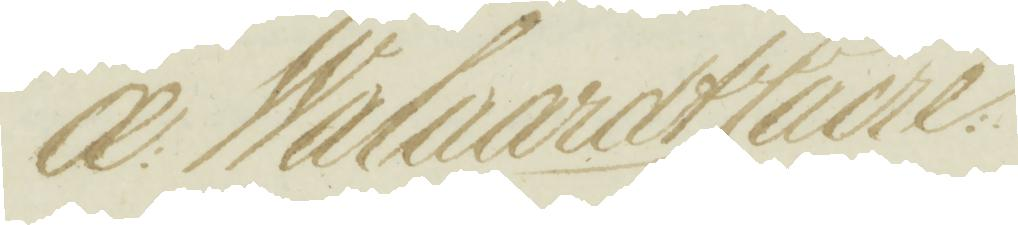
Ae: Walaardt Sacré:
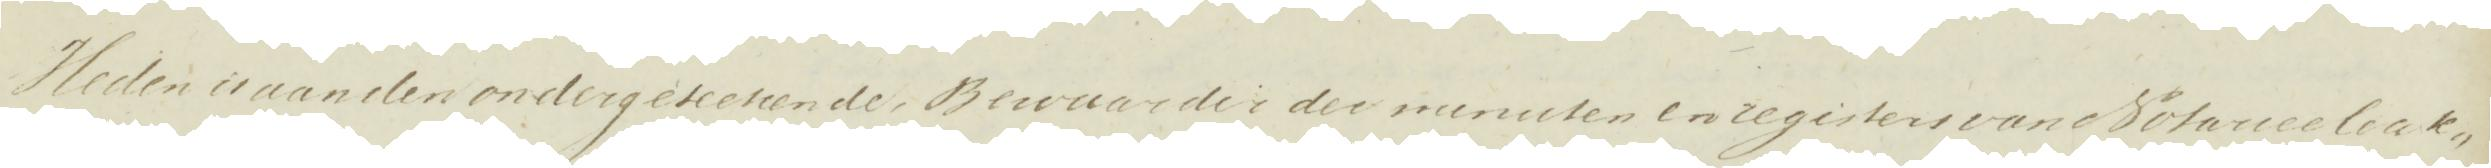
Heden is aan den ondergeteekende, Bewaarder der minuten en registers van Notarieele ak„
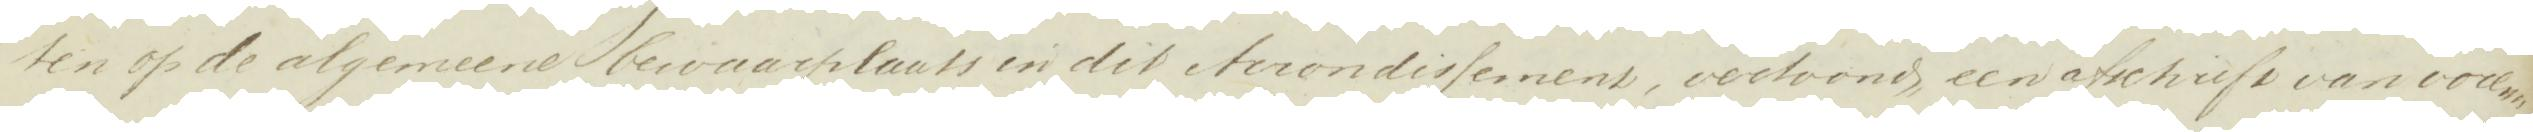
ten op de algemeene bewaarplaats in dit Arrondissement, vertoond, een afschrift van voren
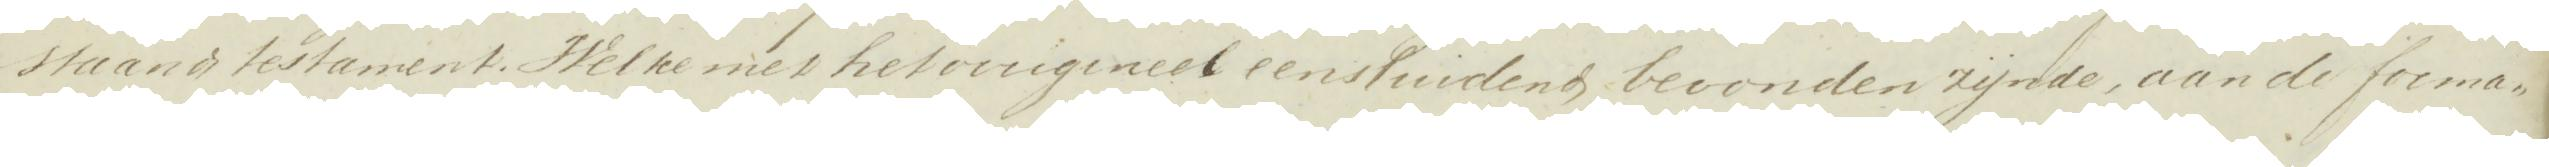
staand testament. Welke met het orrigineel eensluidend bevonden zijnde, aan de forma„
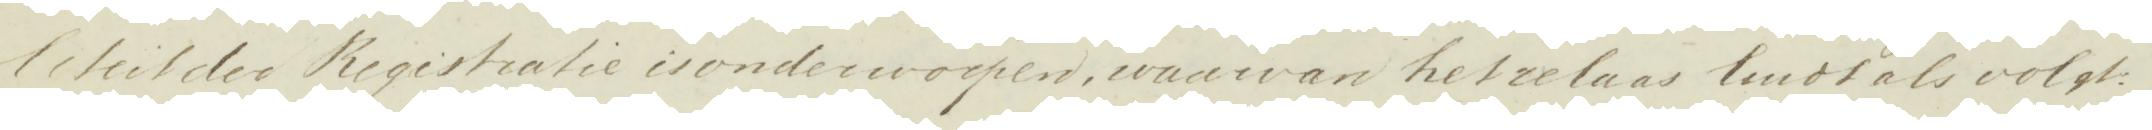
liteit der Registratie is onderworpen, waarvan het relaas luidt als volgt.
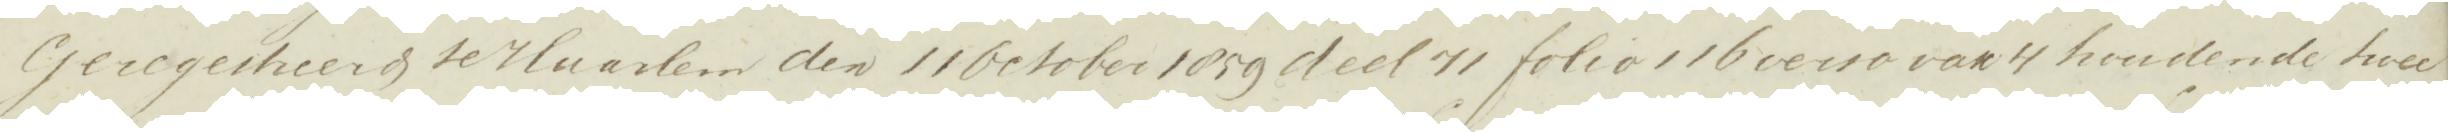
Geregistreerd te Haarlem den 11 October 1859 deel 71 folio 116 verso vak 4 houdende twee
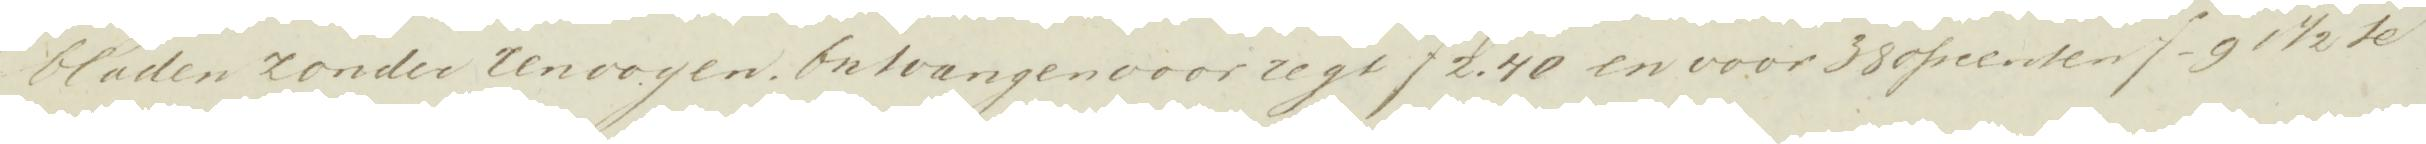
bladen zonder renvooyen, ontvangen voor regt ƒ2.40 en voor 38 opcenten ƒ- 91½ te
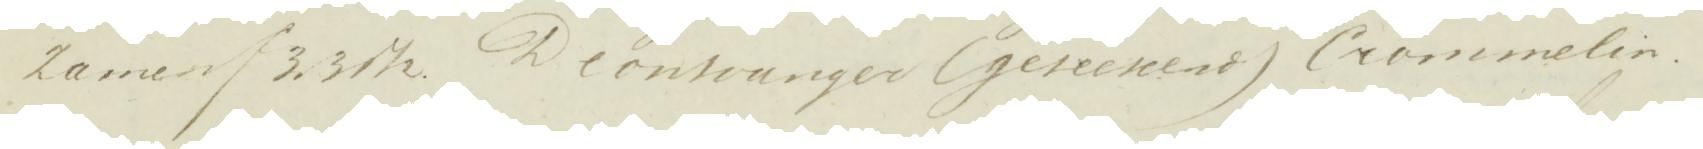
zamen ƒ3.31½. De ontvanger (geteekend) Crommelin.
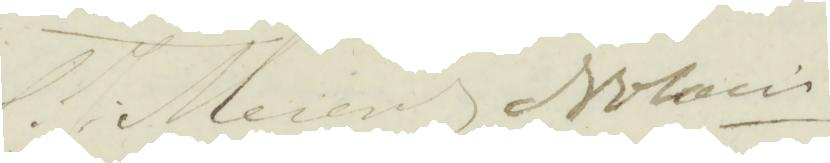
C:J: Meiers Notaris
